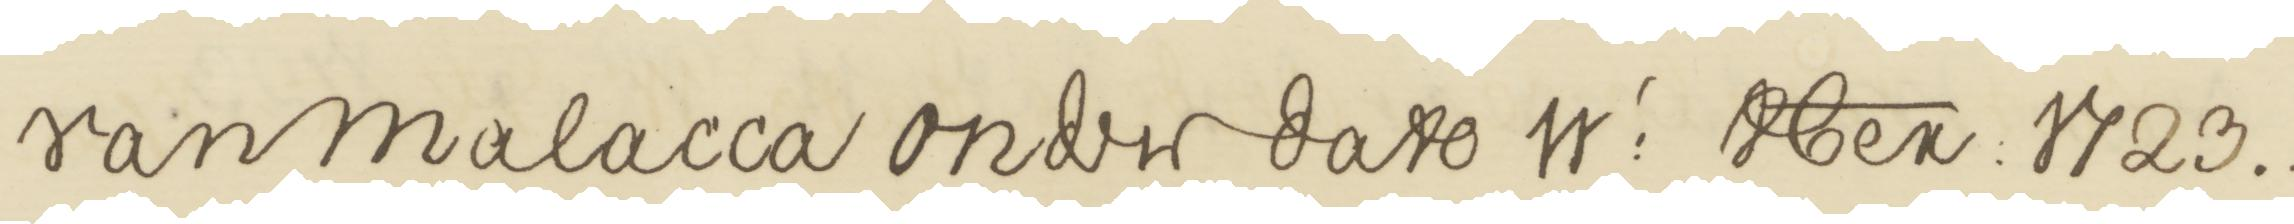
van malacca onder dato 11:' 8ber: 1723.
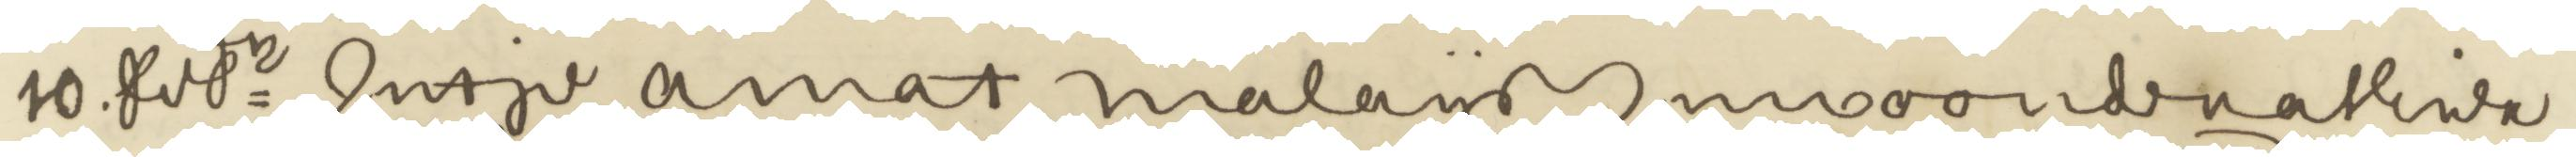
10. feb=ij jntje amat malais inwoonder alhier
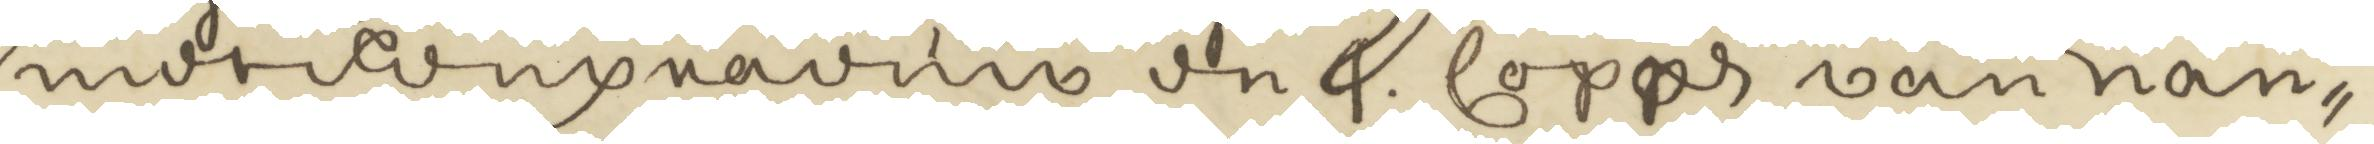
met Een praeuw en 4. Coppen van nan„
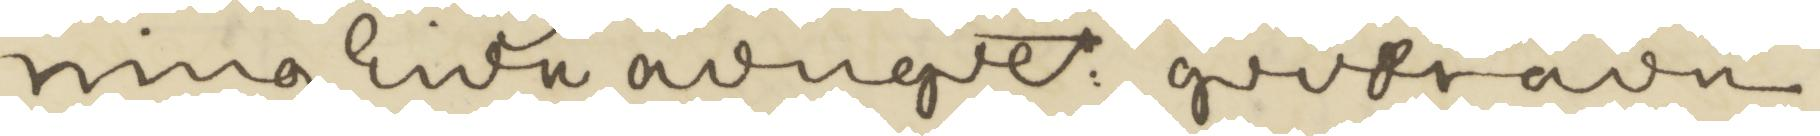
ning hier aengel:t geeft aen
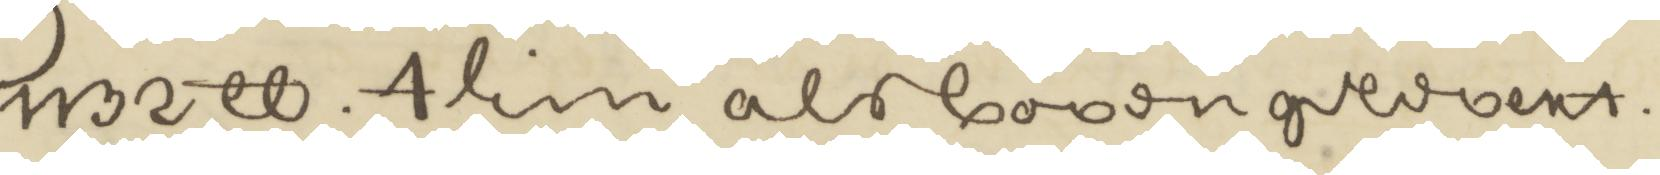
1132 lb. thin als boven gelevert.
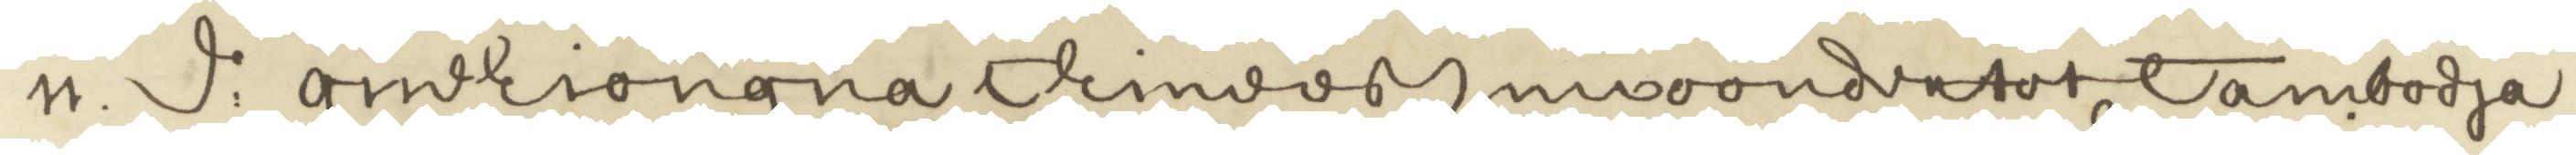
11. _:o quehionqua Chinees jnwoonder tot Cambodja
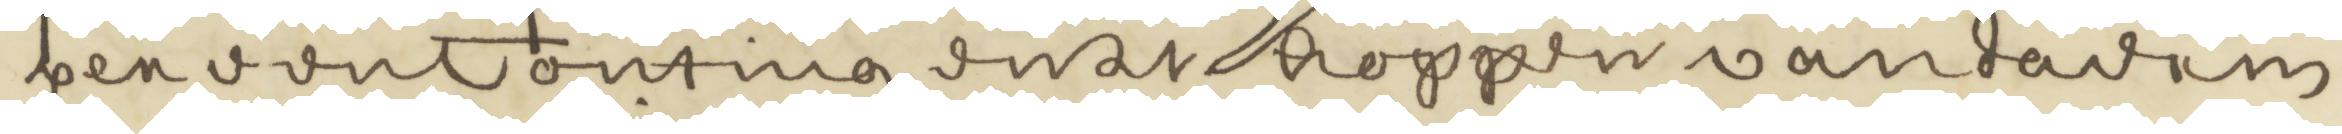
per een Conting en 21 koppen van daer in
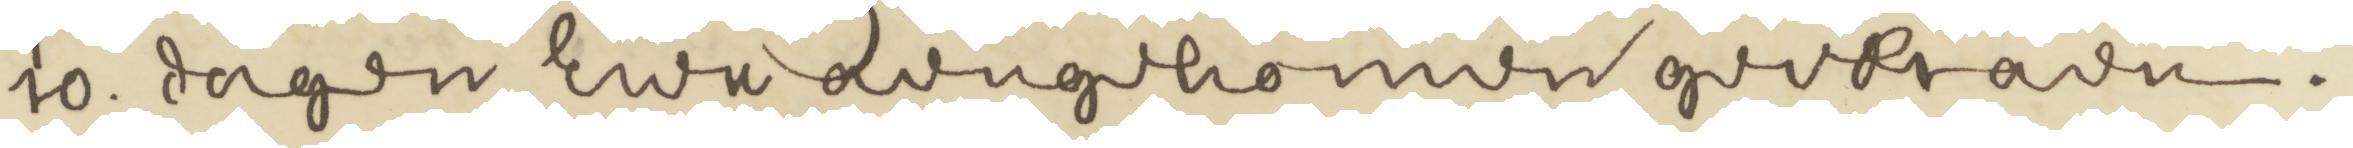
10. dagen hier aengekomen geeft aen.
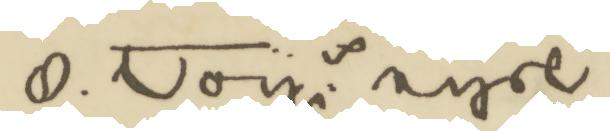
8. Coij:s rijst
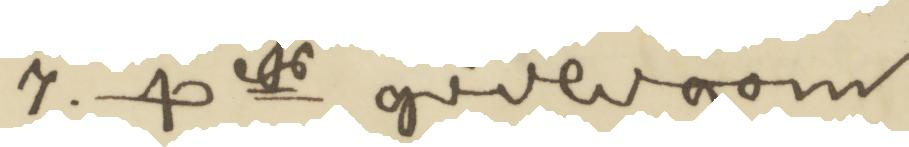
7. p=es geelegom
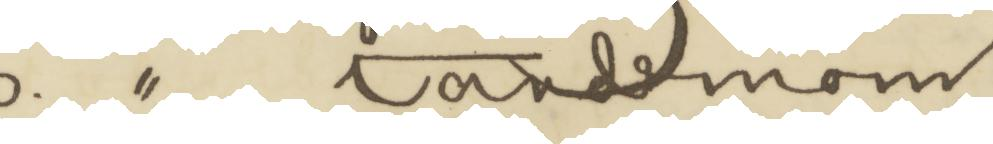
6. „ Cardemom
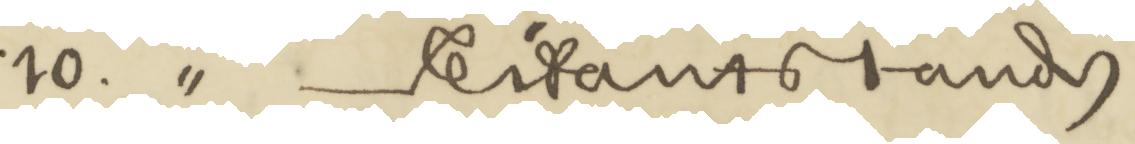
10. „ Elifantstanden
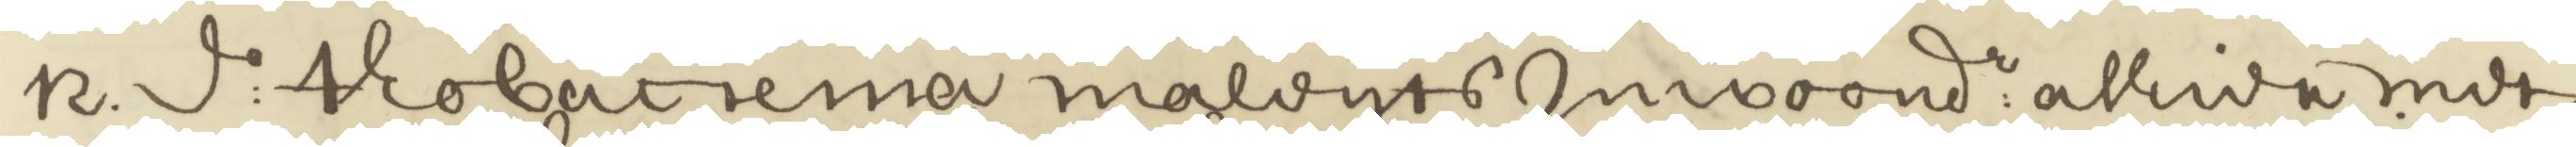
12. _:o thobaciema maleijts jnwoond:r alhier met
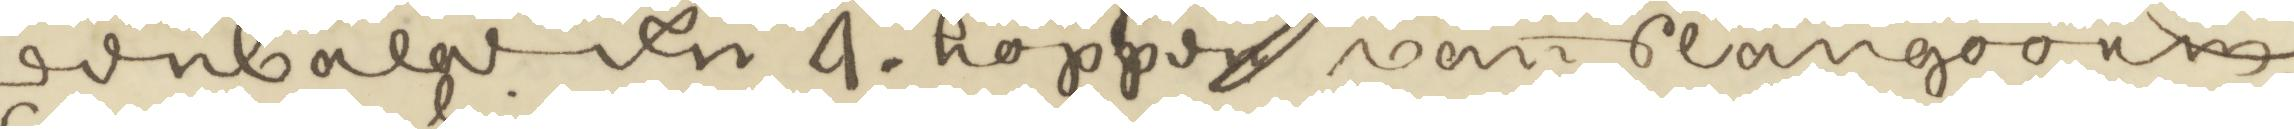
een baloe En 4. koppen van slangoor in
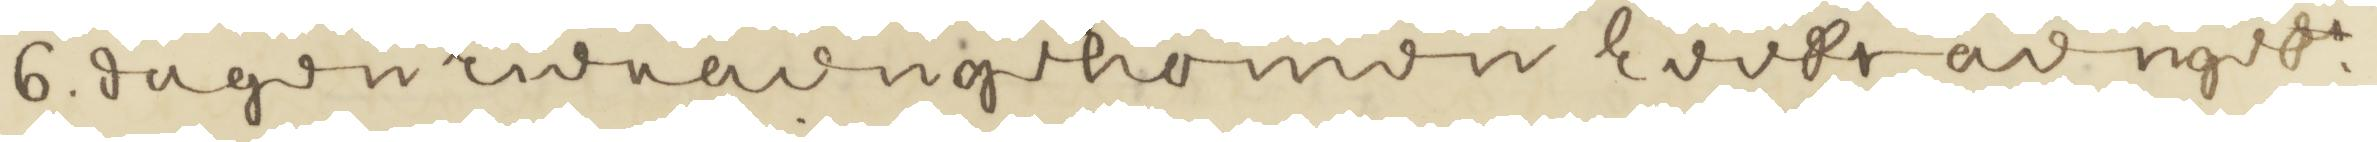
6. dagen hier aengekomen heeft aengeb:t
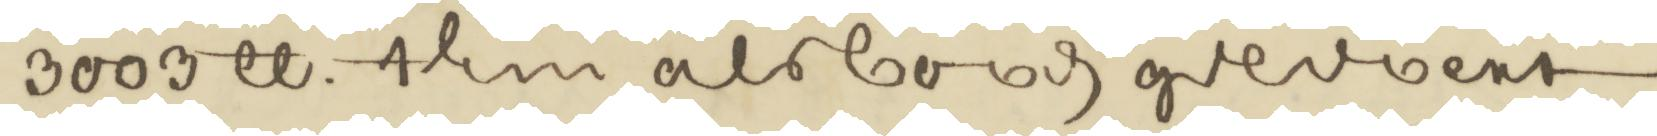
3003 lb. thin als boven gelevert
